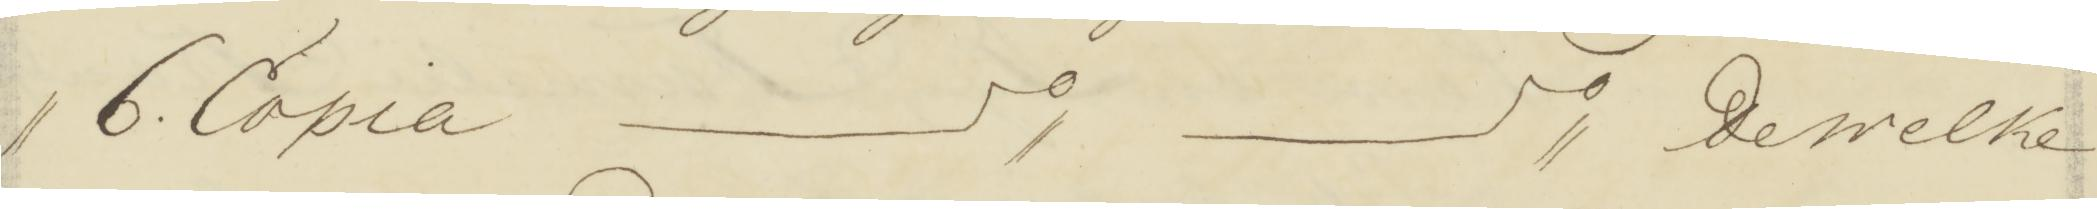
„ 6. Copia _„o _„o dewelke
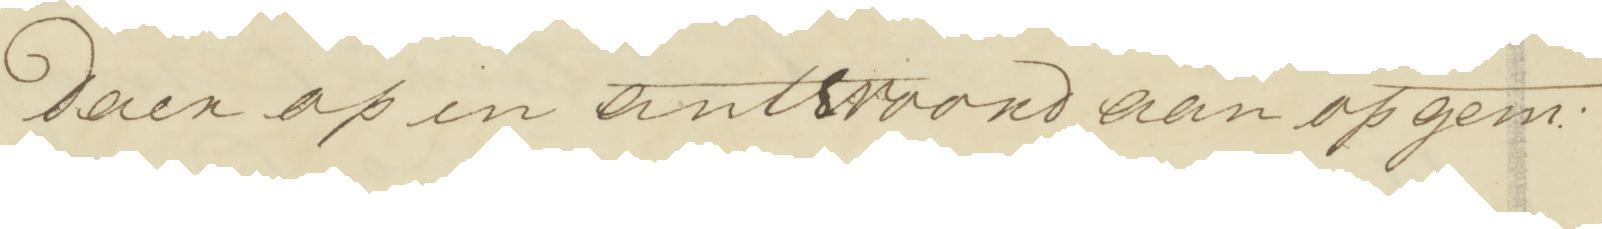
daer op in antwoord aan op gem:
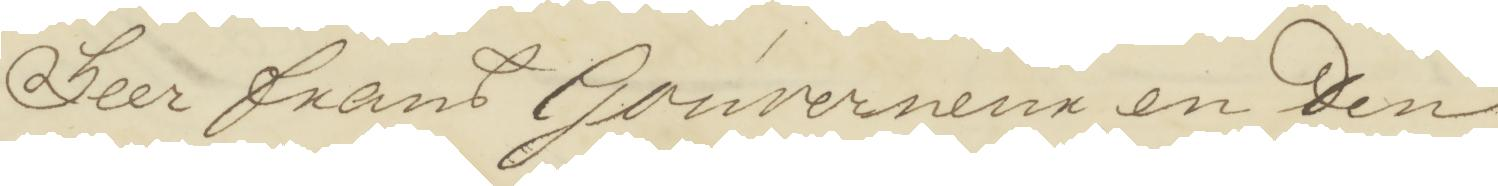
heer frans Gouverneur en den
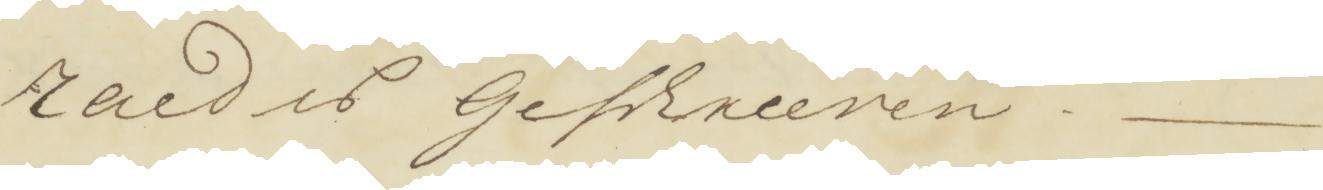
raed is geschreeven. —
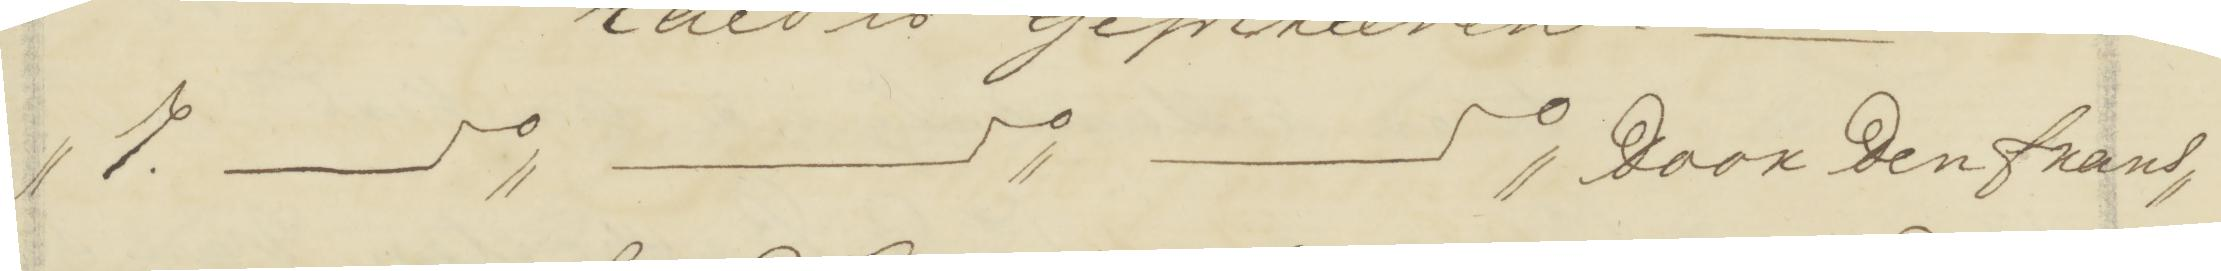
„ 7. _„o _„o _„o door den frans„
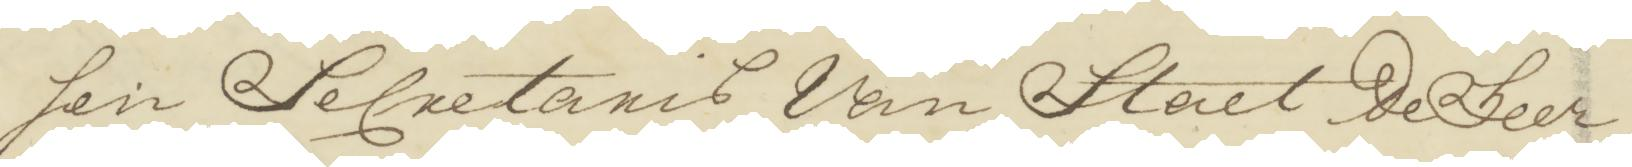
sen secretaris van staet de heer
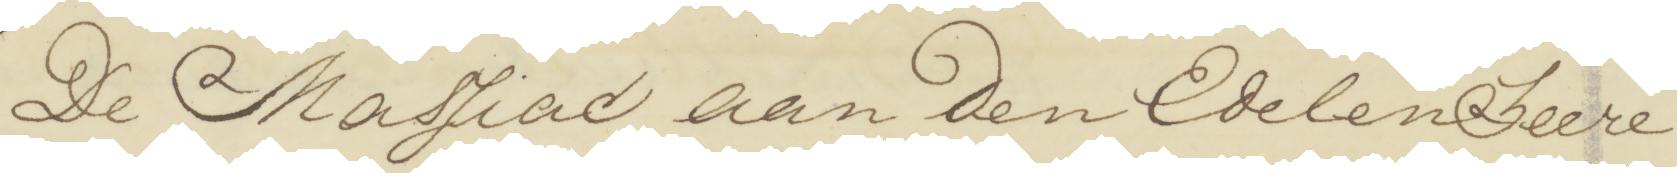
De Massiac aan den Edelen heere
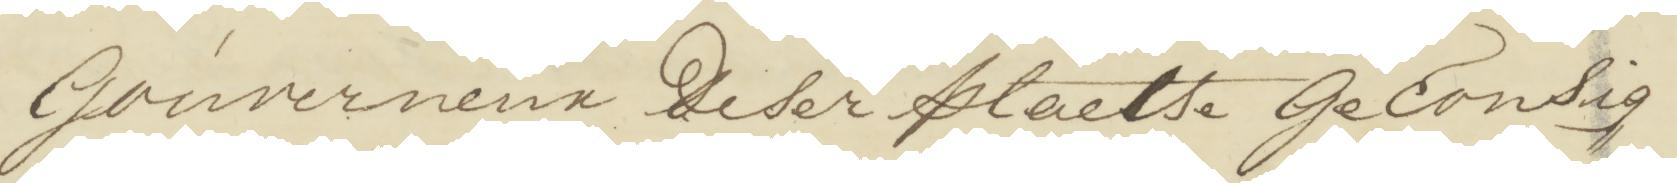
Gouverneur deser plaetse geconsig„
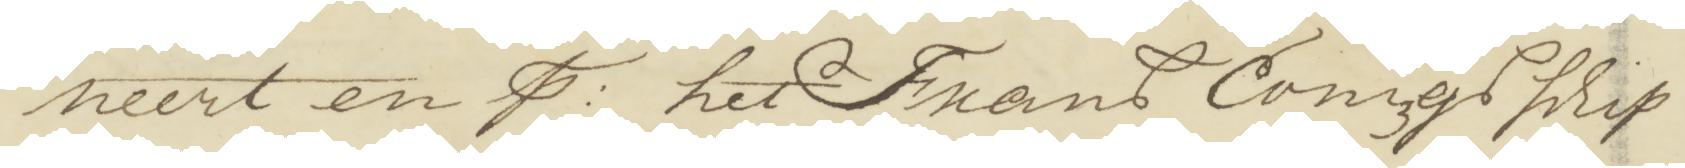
neert en p: het Frans Conings schip
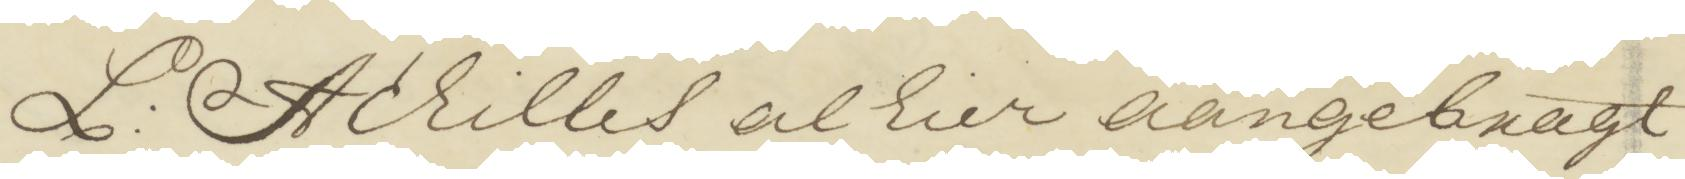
L: Achilles alhier aangebragt
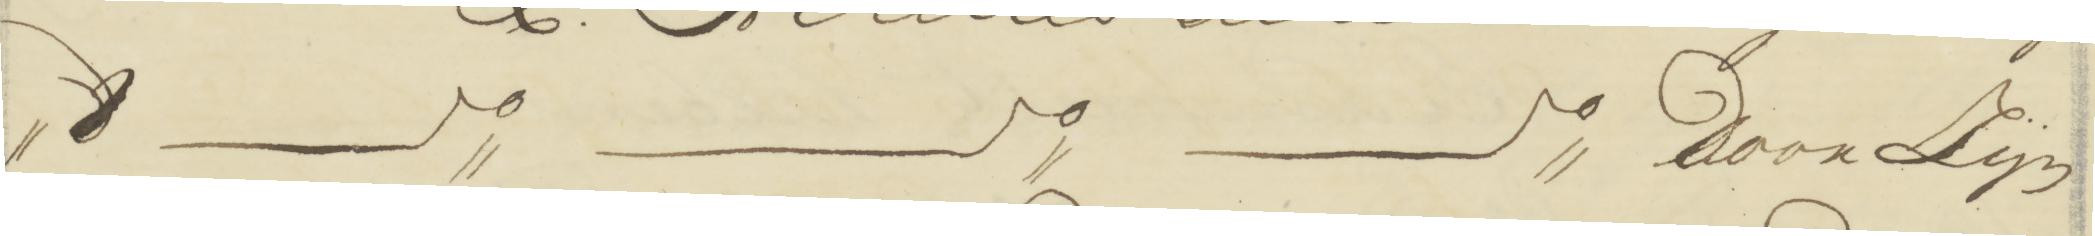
„ 8 _„o _„o _„o door zijn
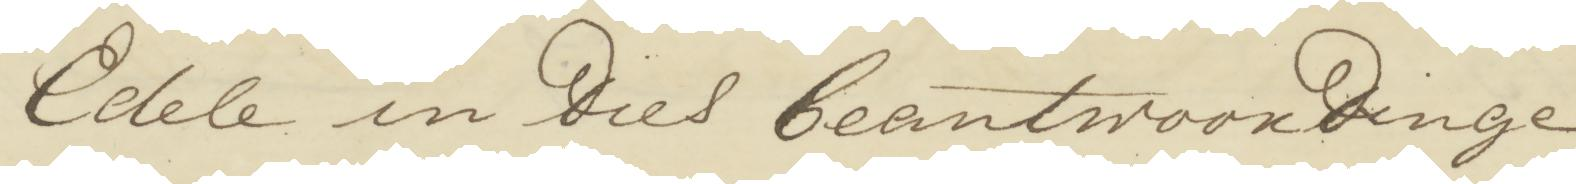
Edele in dies beantwoordinge
